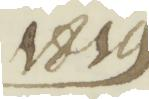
1819.
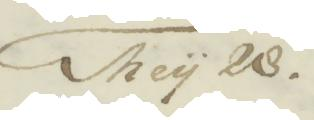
Meij 28.
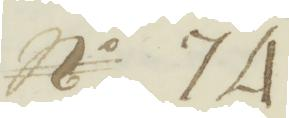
N=o 74
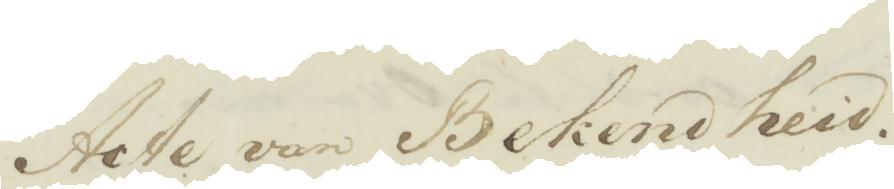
Acte van Bekendheid.
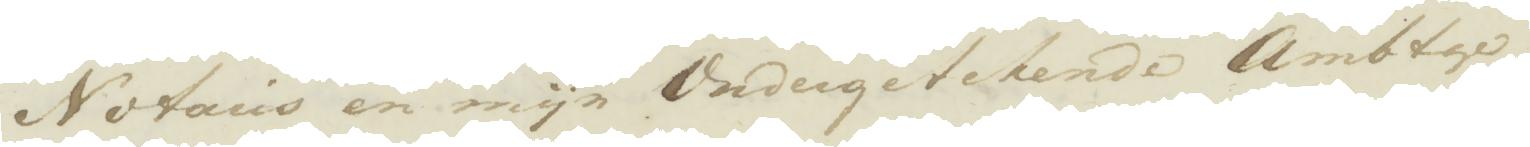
Notaris en mijn ondergetekende Ambtge
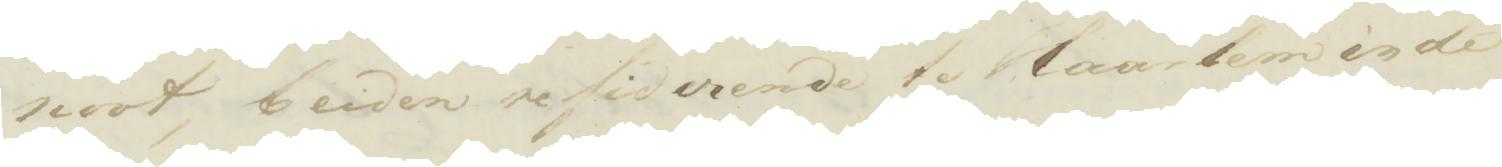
noot, beiden residerende te Haarlem in de
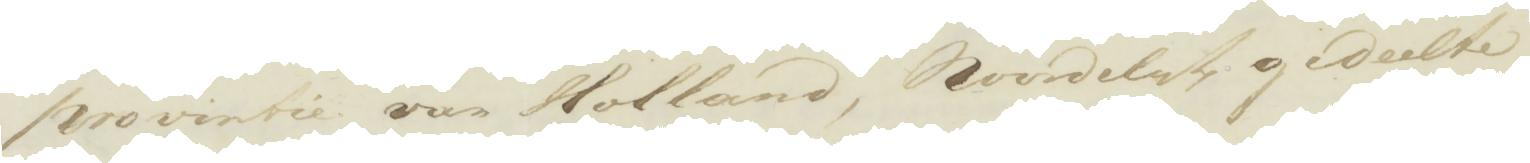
provintie van Holland, Noordelijk gedeelte
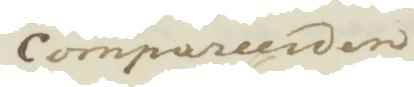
Compareerden
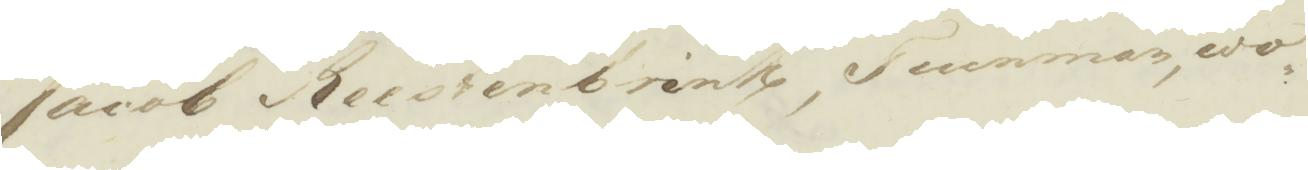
Jacob Reestenbrink, Tuinman, wo„
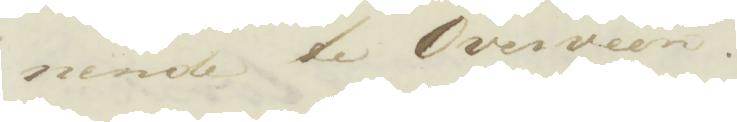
nende te Overveen.
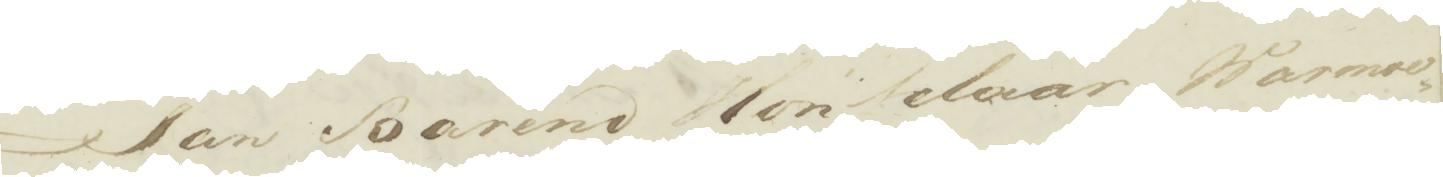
Jan Barend Honselaar Warmoe„
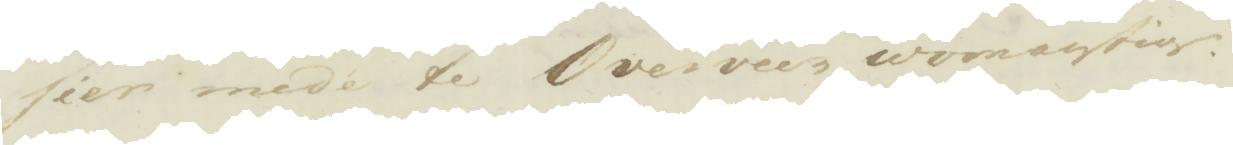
sier mede te Overveen woonagtig.
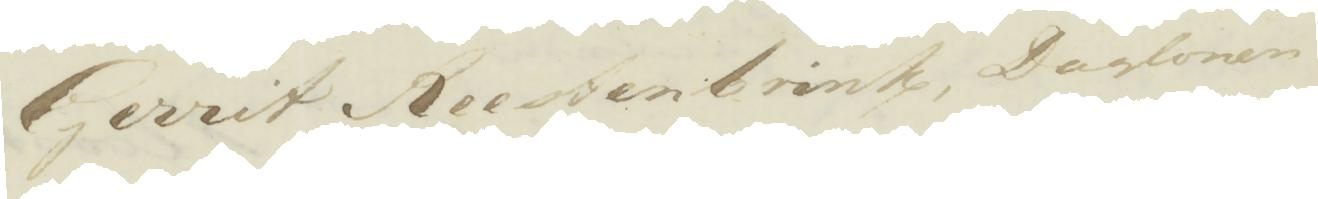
Gerrit Reestenbrink, Dagloner
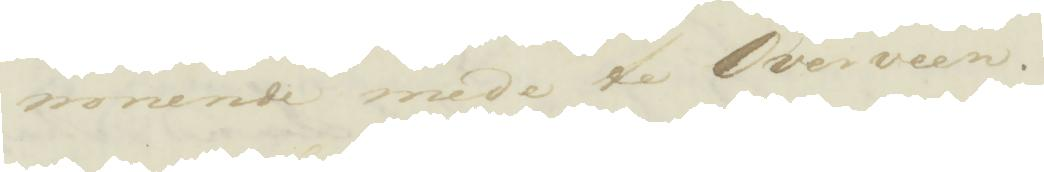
wonende mede te Overveen.
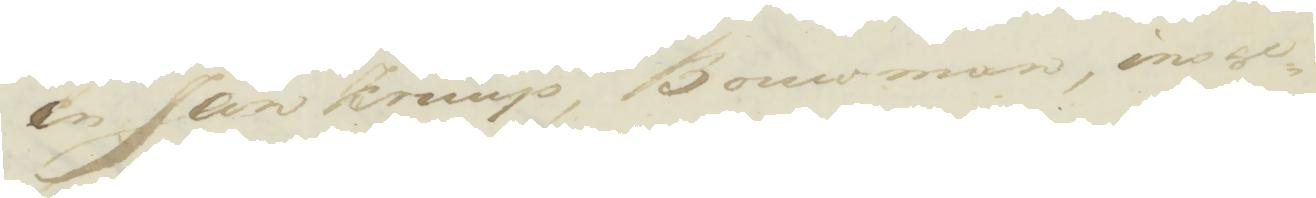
en Jan Kruup, Bouwman, insge„
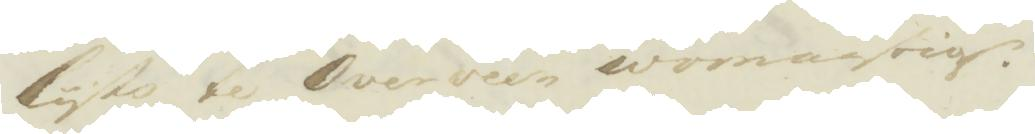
lijk te Overveen woonagtig.
